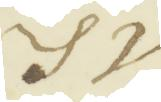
S V
